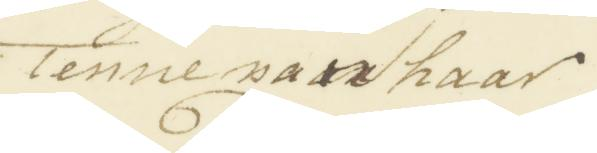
tenne van haar
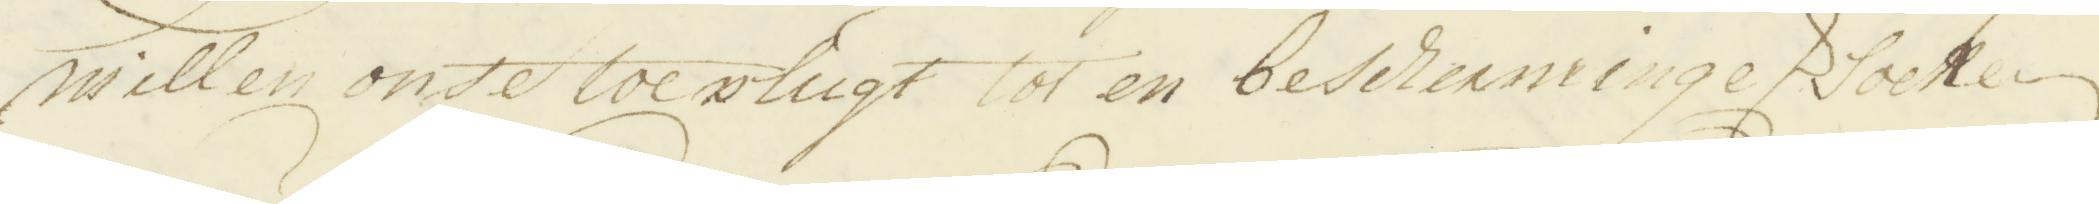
willen onse toevlugt tot en bescherminge versoeke
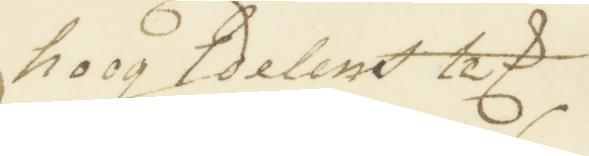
hoog Edelens te ver
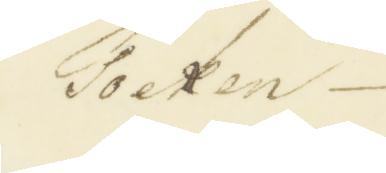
soeken
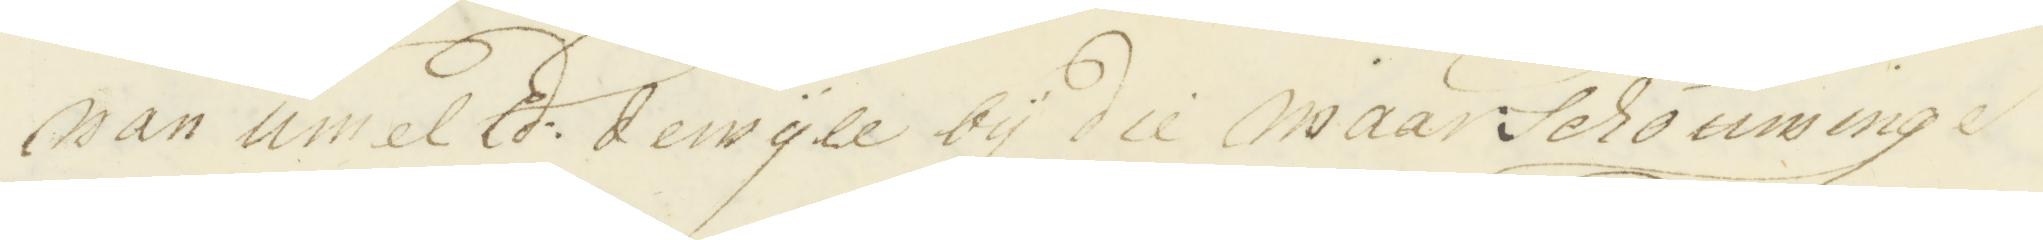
van u wel Ed: dewijle bij die waarschouwinge
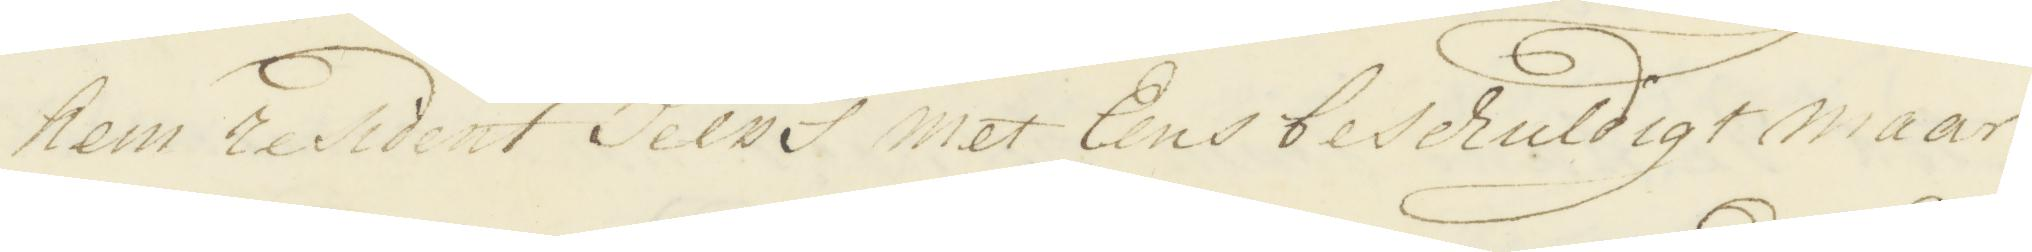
hem resident selvs met Eens beschuldigt maar
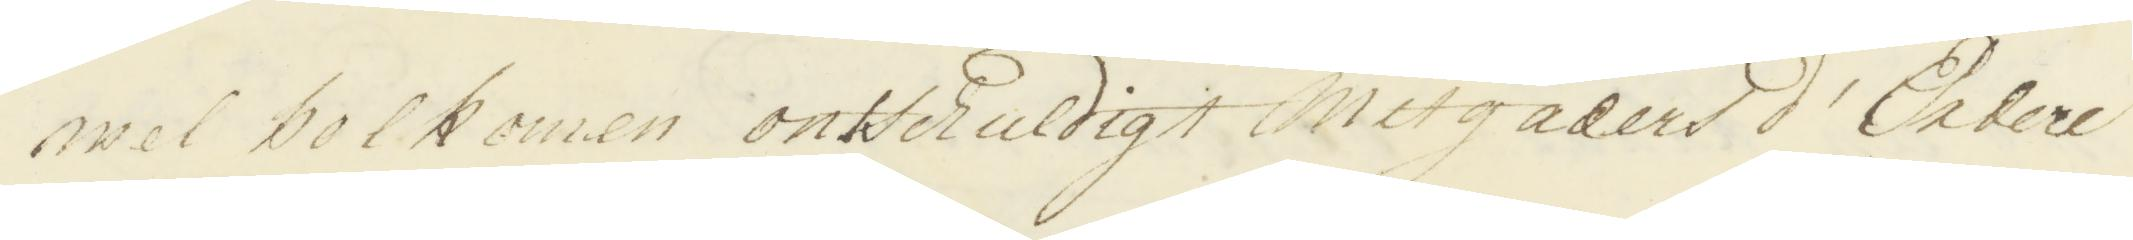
wel volkomen ontschuldigt mitgaders d’Erdere
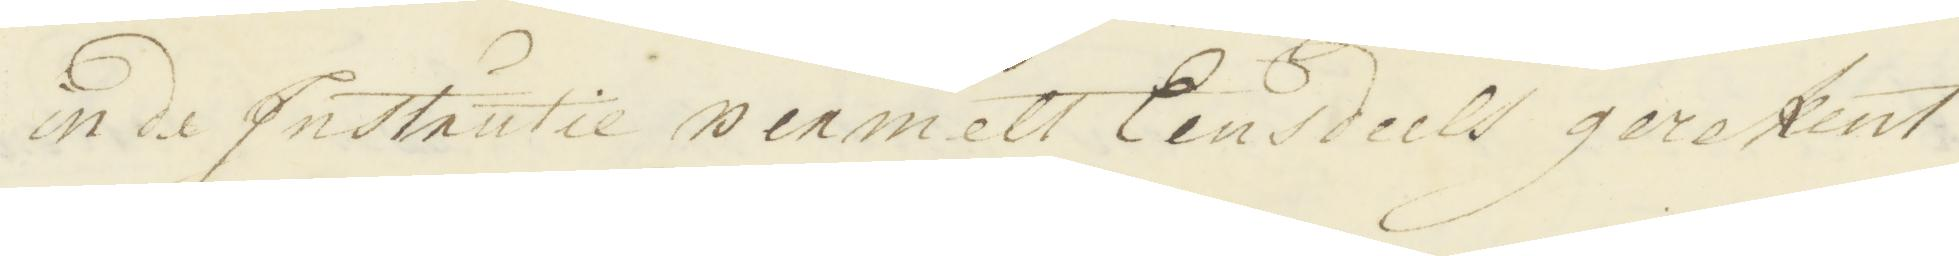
in de Jnstrutie vermelt Eensdeels gerekent
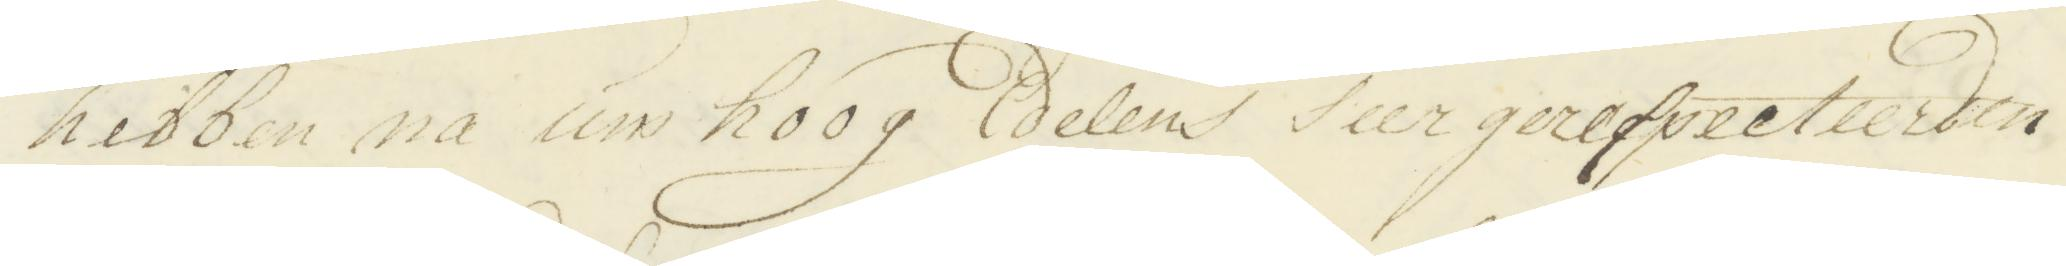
hebben na uw hoog Edelens seer gerespecteerden
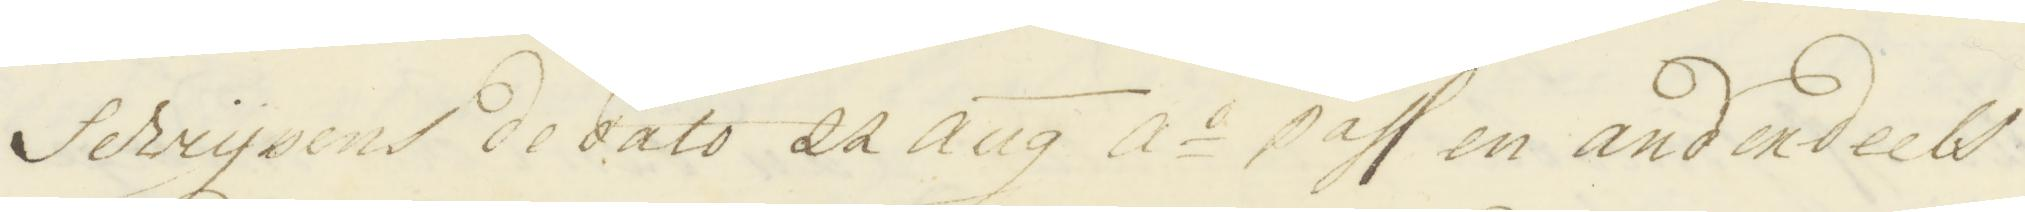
schrijvens de dato 22 aug a=o pass en anderdeels
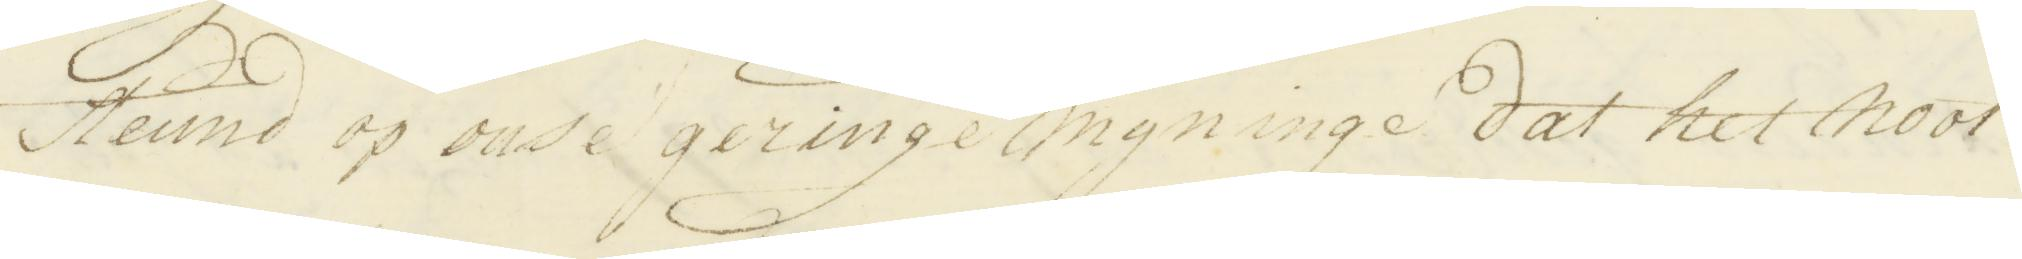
steund op onse geringe myninge dat het noot
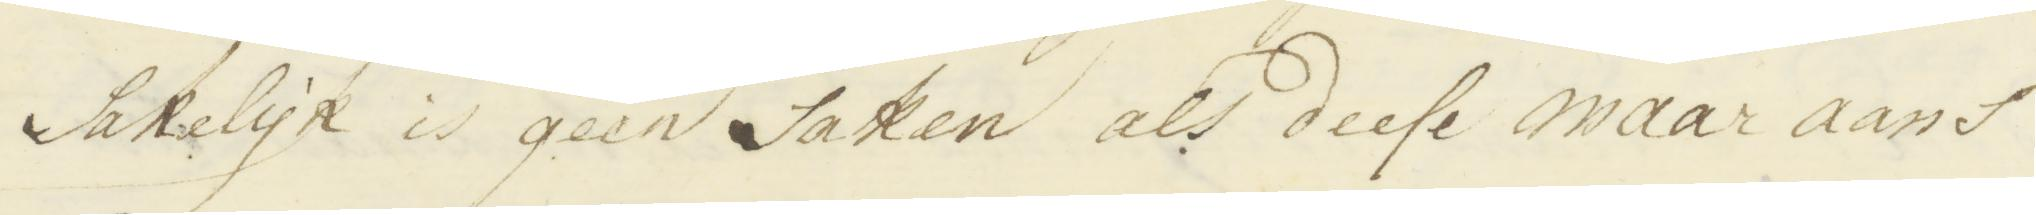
sakelijk is geen saken als deese waar aans
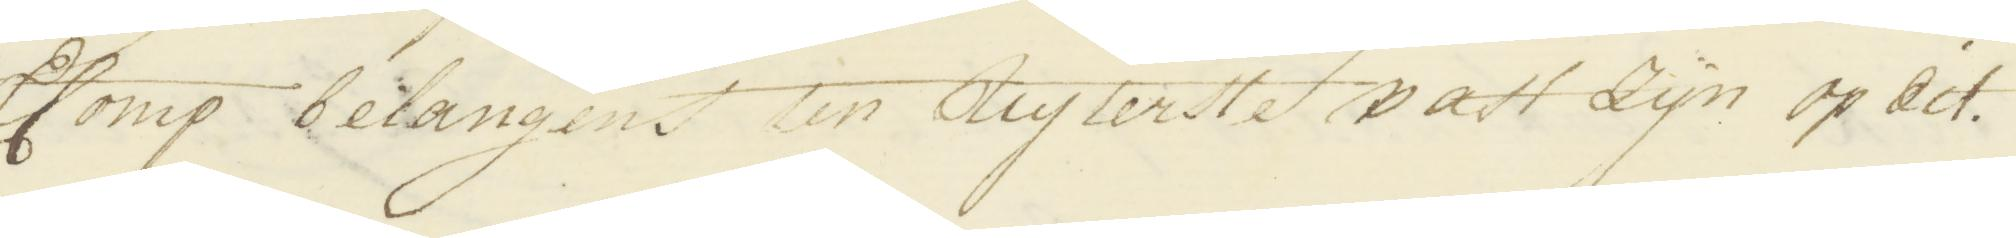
EComp belangens ten uyterste vast zijn op dit.
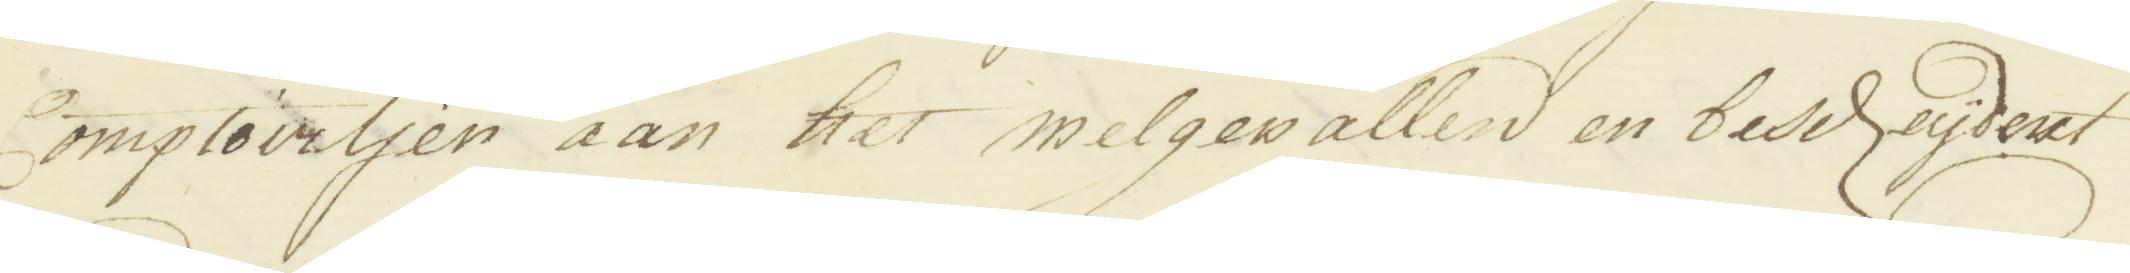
Comptoirtjen aan het welgevallen en bescheijdent
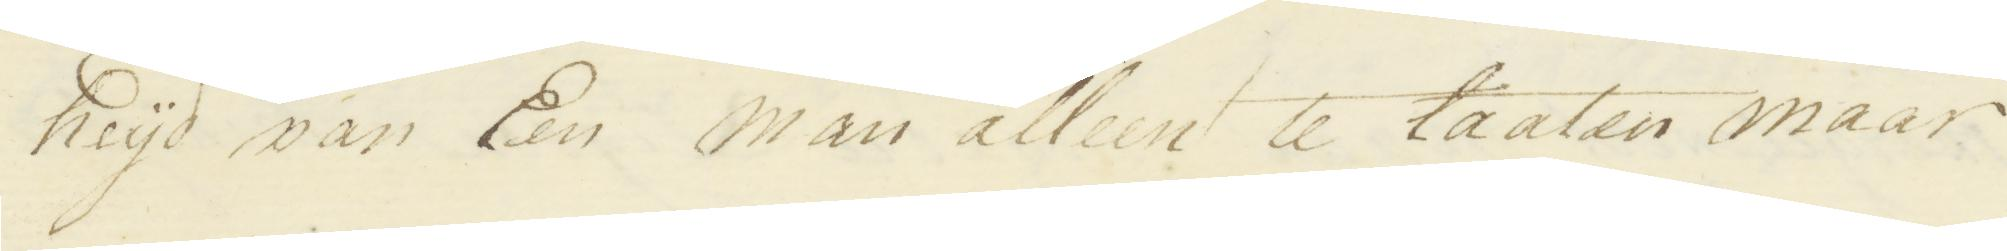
heijd van Een man alleen te laaten maar
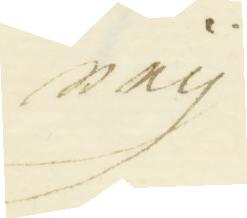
vrij
